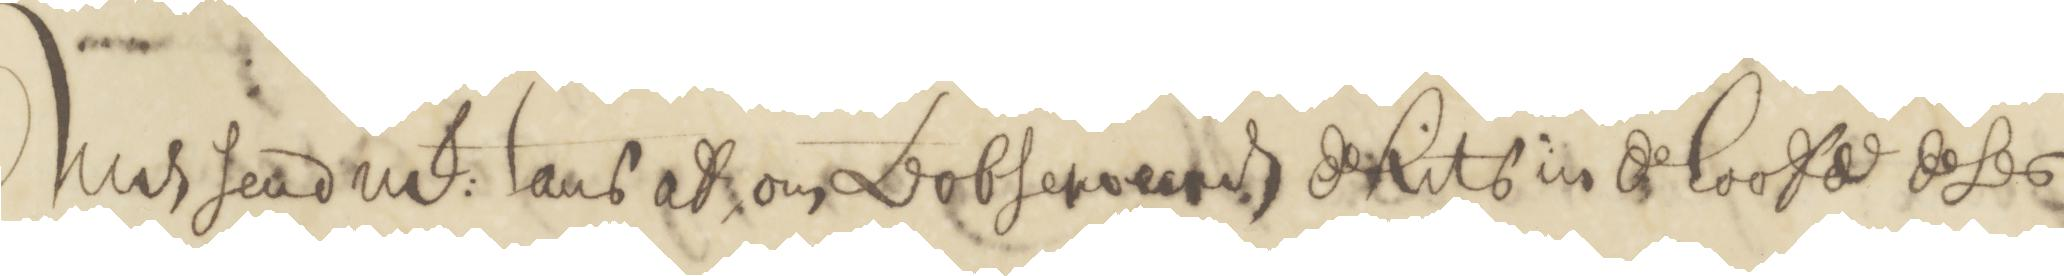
Men send uE: tans af, om te observeeren de kits in de hoofde deses
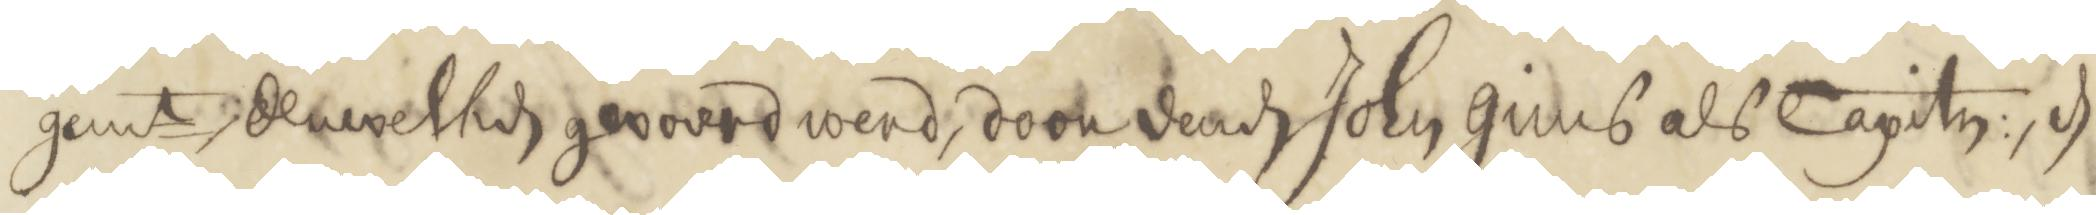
gem=t, denwelken gevoerd werd, door eenen John guns als Capitn:, en
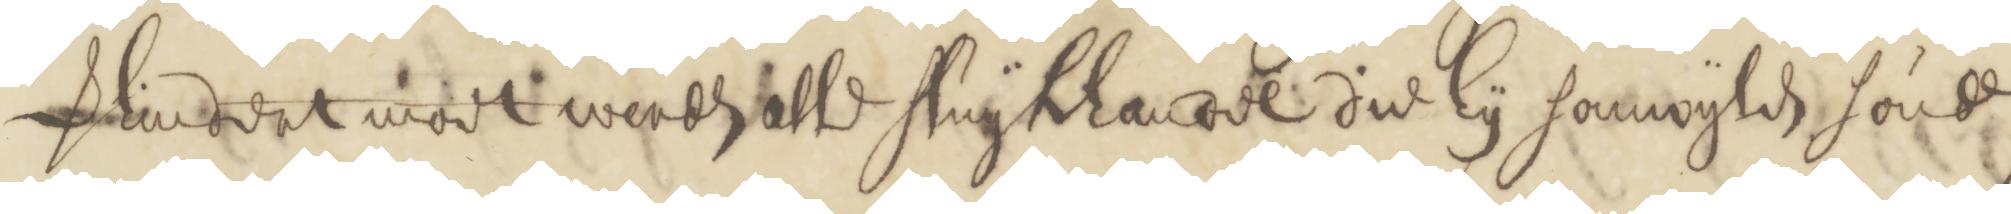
verhindert moet werden alle sluijkhandel die hij somwijlen soude
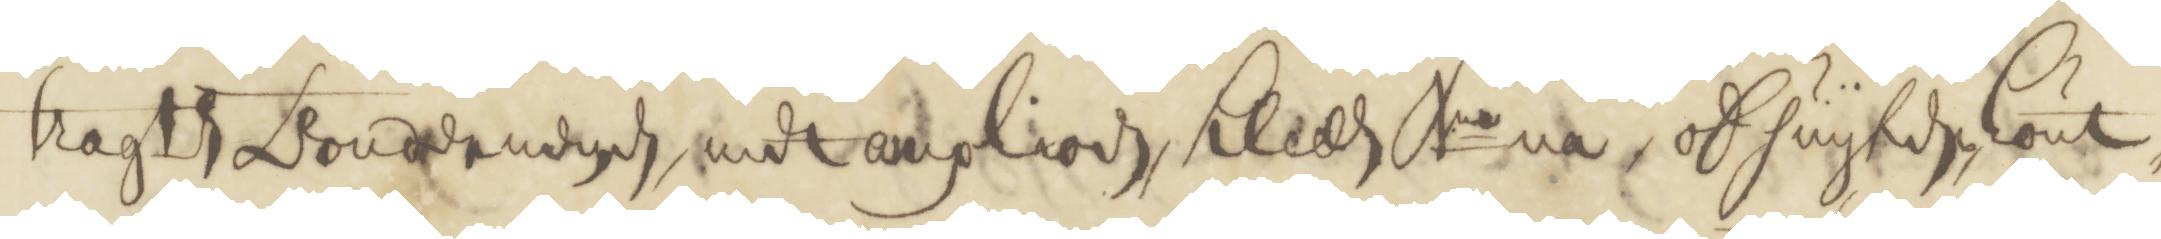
tragten te ondernemen, met amphioen, kleden &=tra na, of suijker, hout
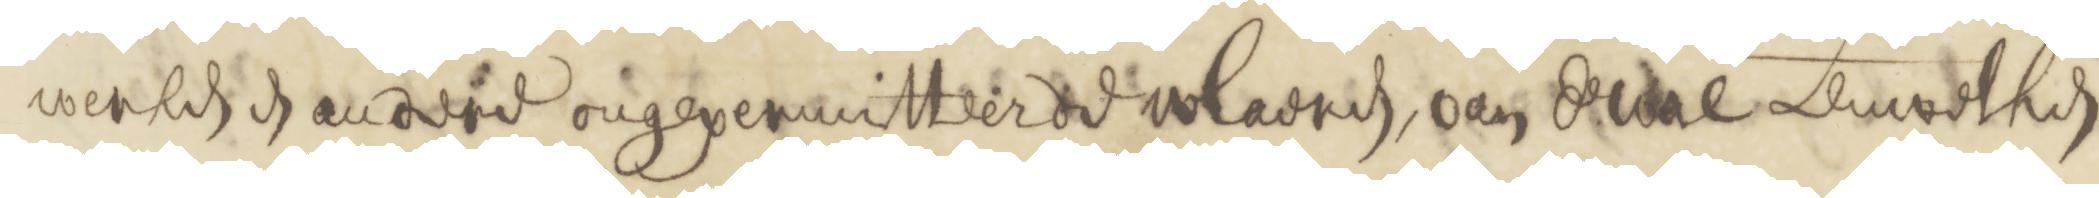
werken en andere ongepermitteer de whaeren, van de wal ten welken
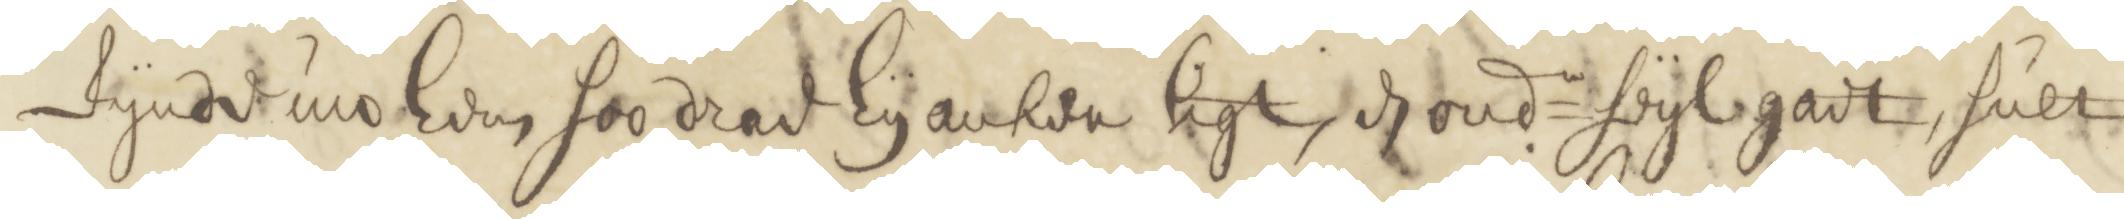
Eijnde uw hem Soo drae hij anker ligt, en ond=r seijl gaet, sult
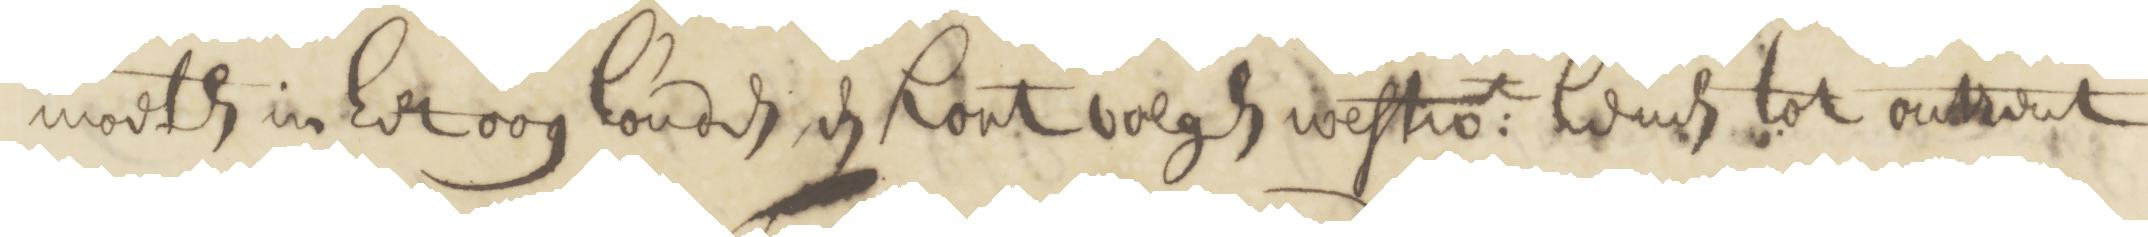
moeten in het oog houden, en kort volgen westw:t henen tot ontrent
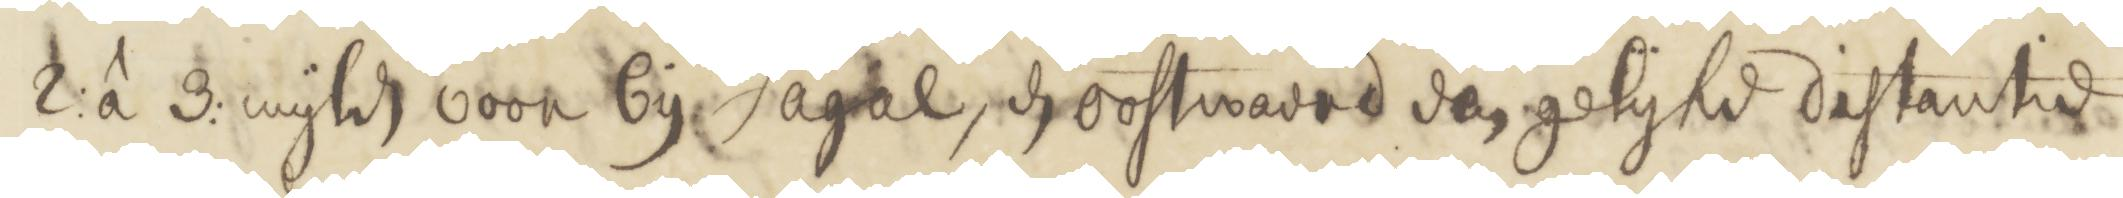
2: â 3: mijlen voor bij Tagal, en oostwaerd een gelijke distantie
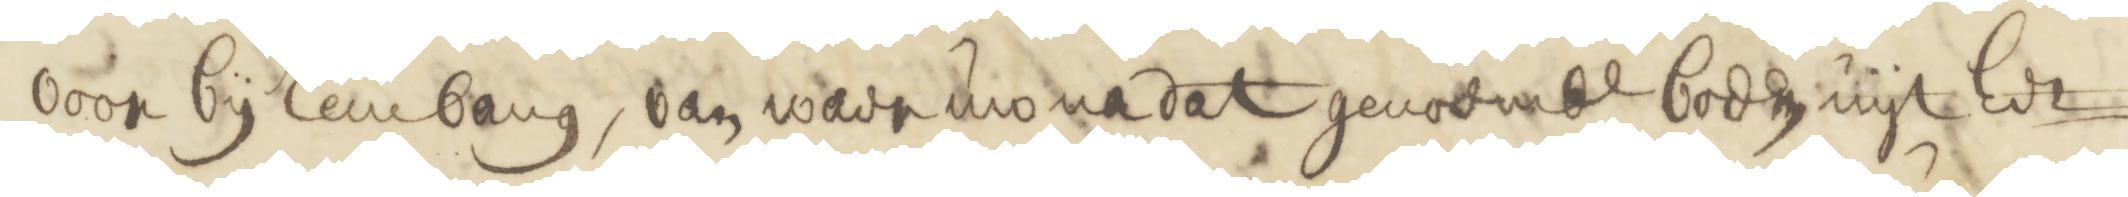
voor bij Rembang, van waer uw na dat genoemde bodem uijt het
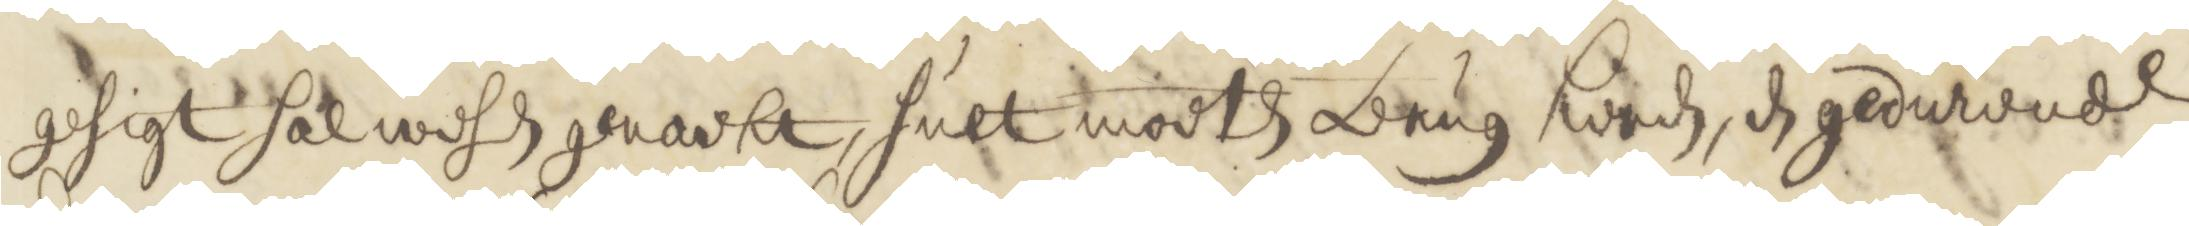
gesigt sal wesen geraekt, sult moeten terug keren, en gedurende
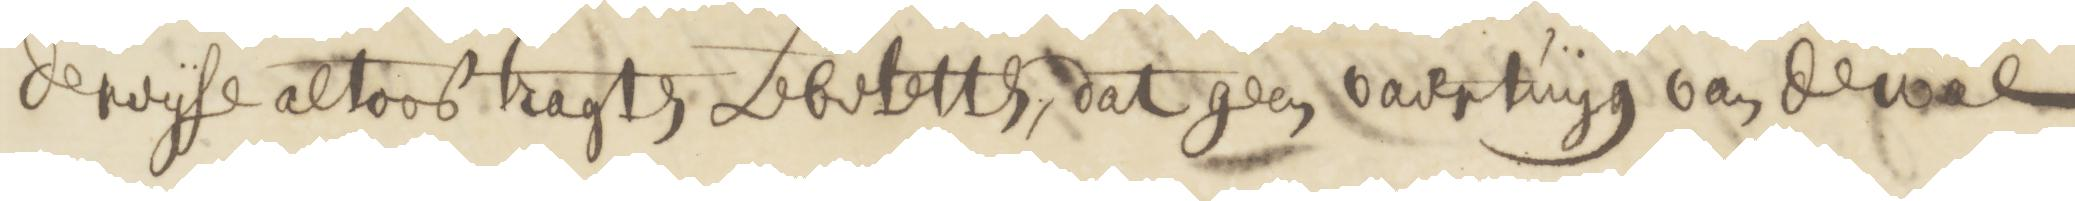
de reijse altoos tragten te beletten, dat geen vaertuijg van de wal
